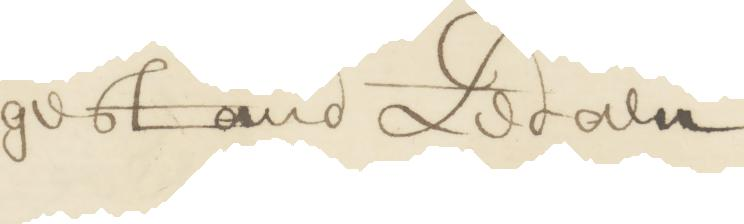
gestand tedoen
